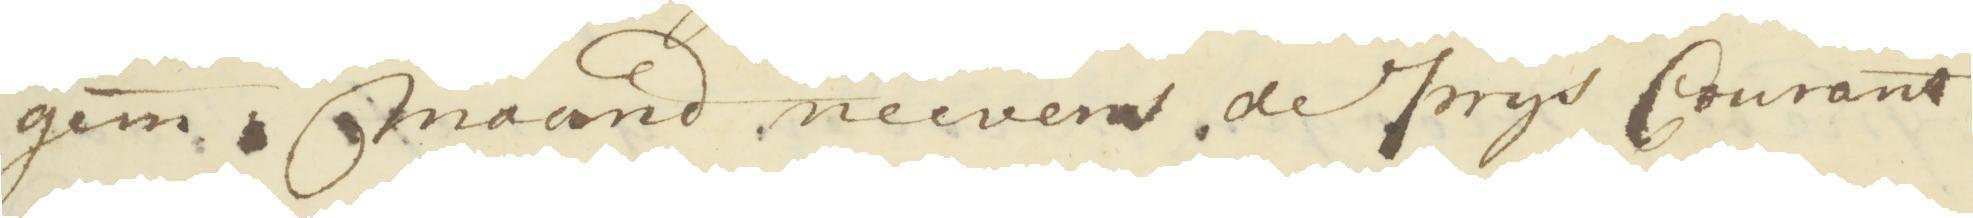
gem Maand neevens de prijs Courant
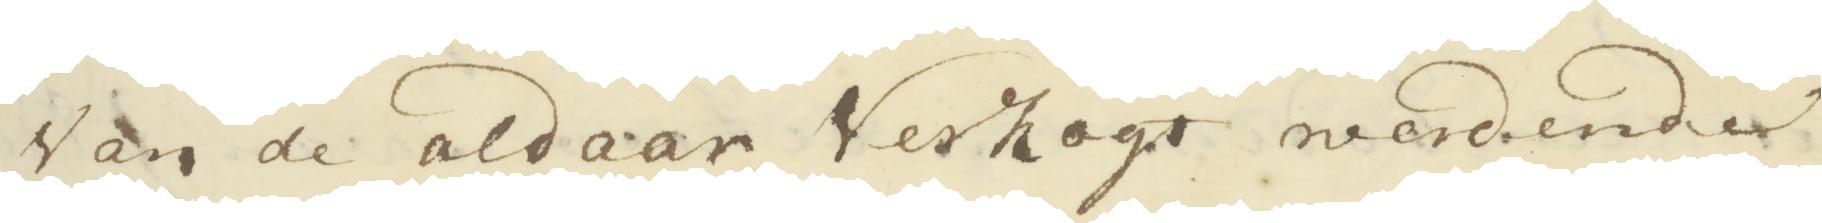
van de aldaar verkogt werdende
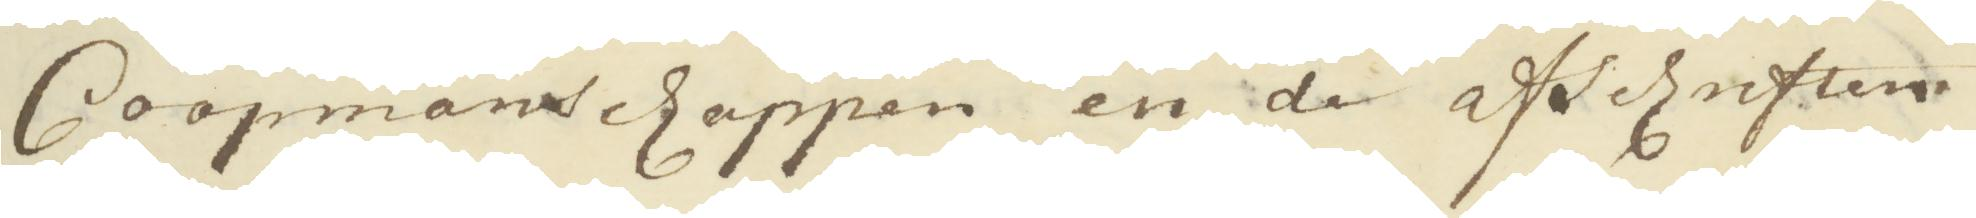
Coopmanschappen en de afschriften
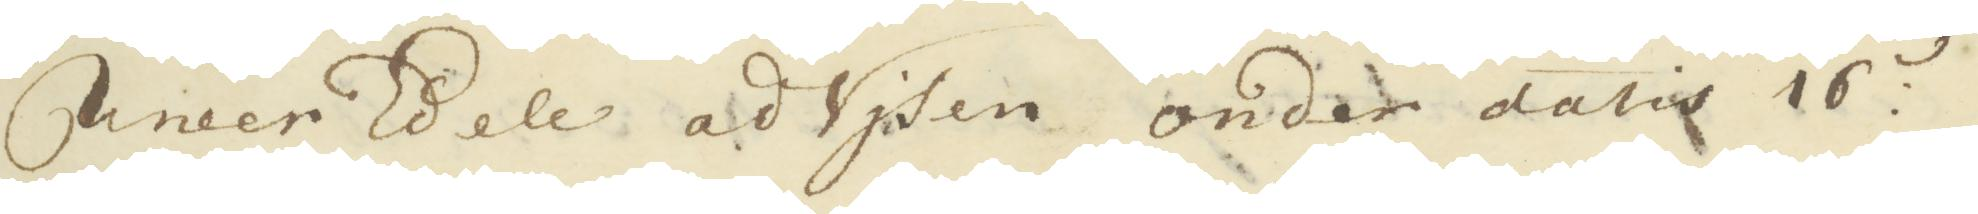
Uwer Edele advjsen onder datis 16:'
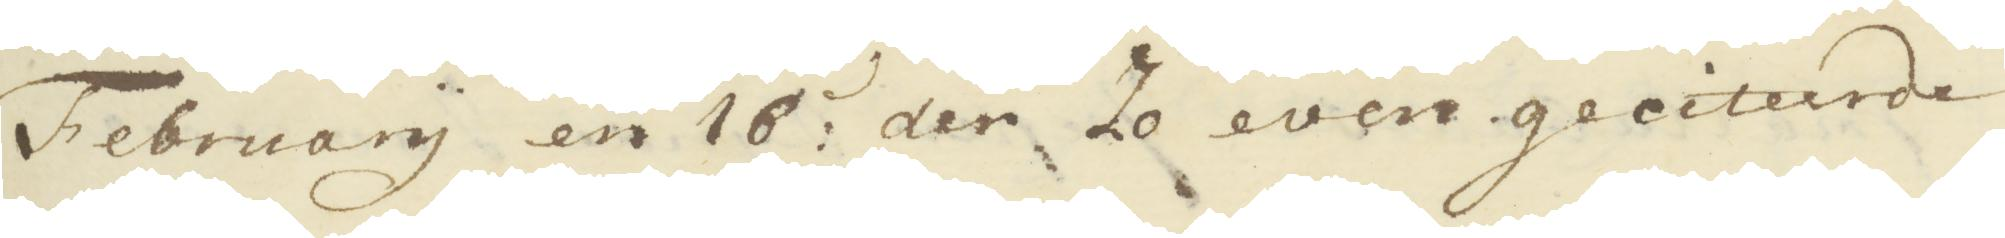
Februarij en 16:' der Zo even geciteerde
